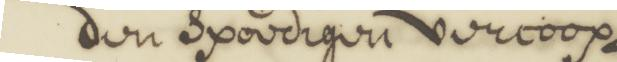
den spoedigen vercoop
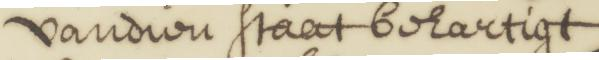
vandien staat behartigt
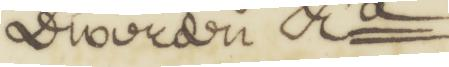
tewerden Et=a
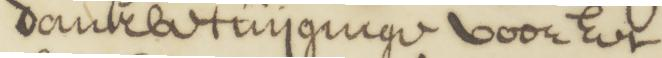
dank betuijginge voor het
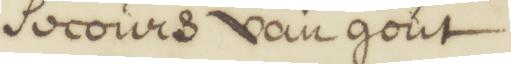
secours van gout
